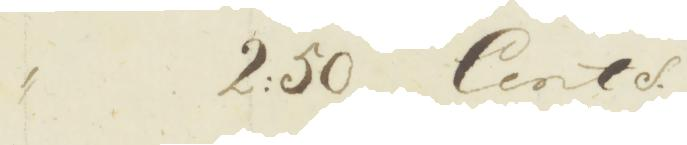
„ 2: 50 Cents.
